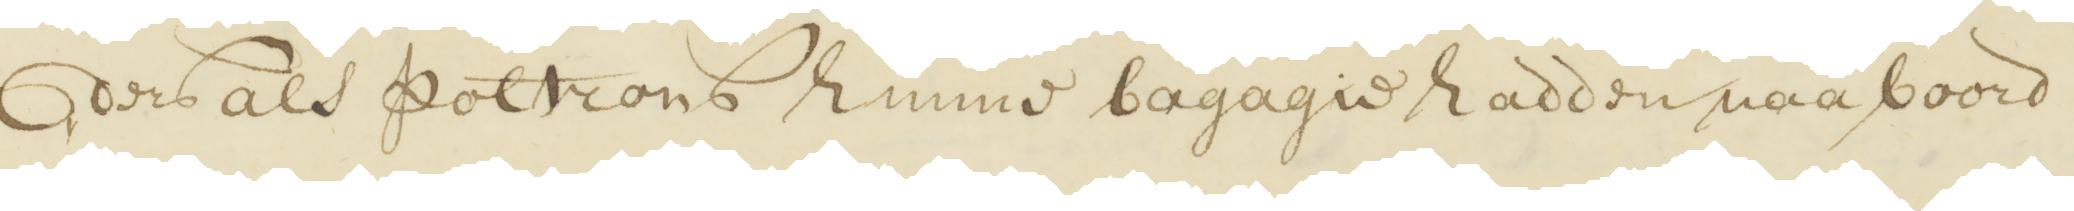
ders als poltrons hunne bagagie hadden naa boord
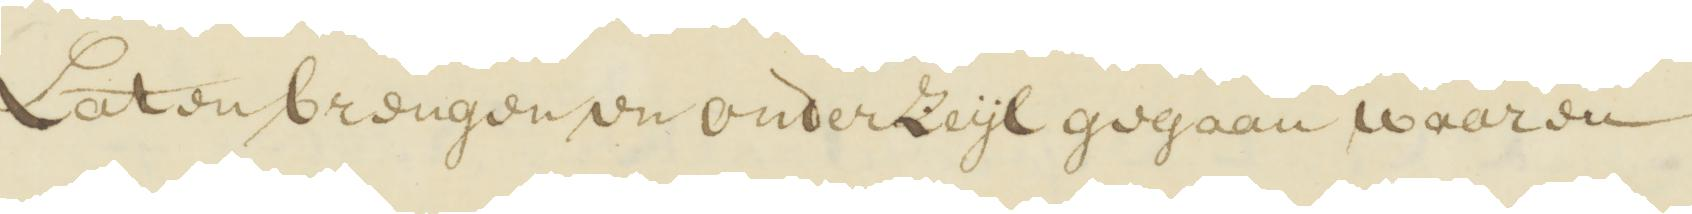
Laten brengen en onderzeijl gegaan waaren
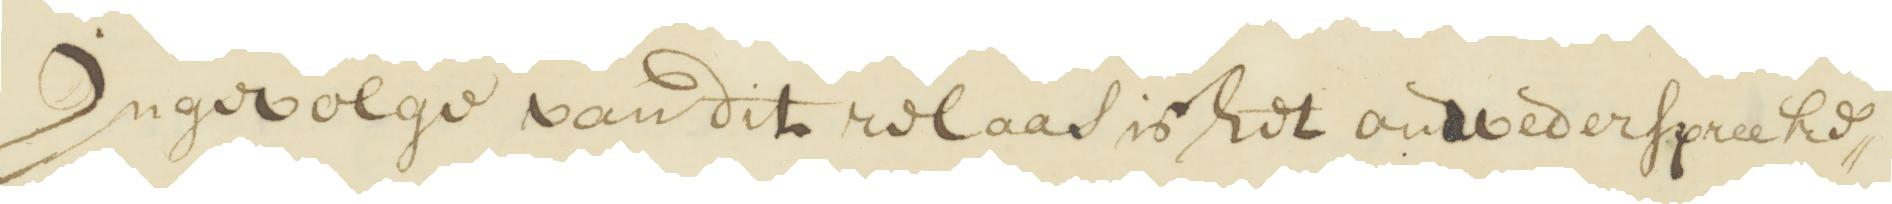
Jngevolge van dit relaas is het onwederspreeke„
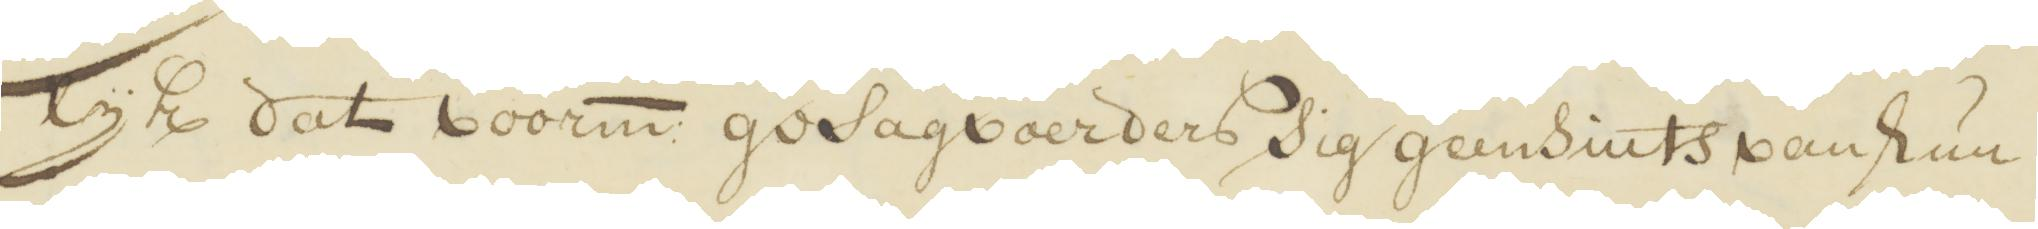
lijk dat voorm: gesagvoerders sig geensints van hun
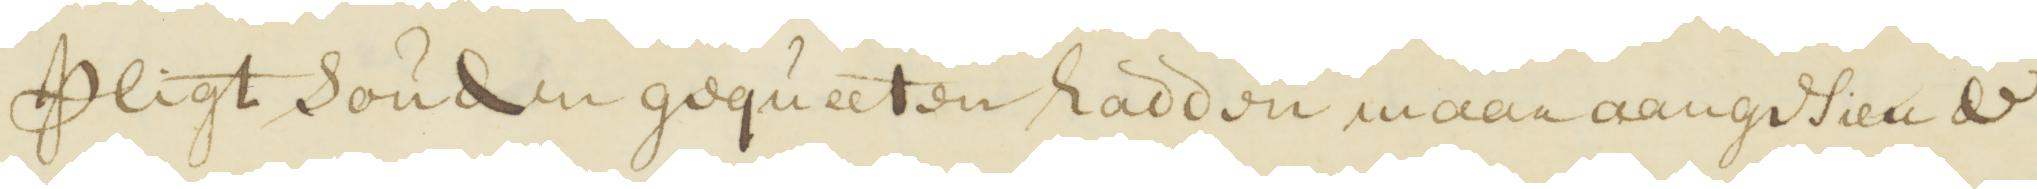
pligt souden gequeeten hadden maar aangesien de
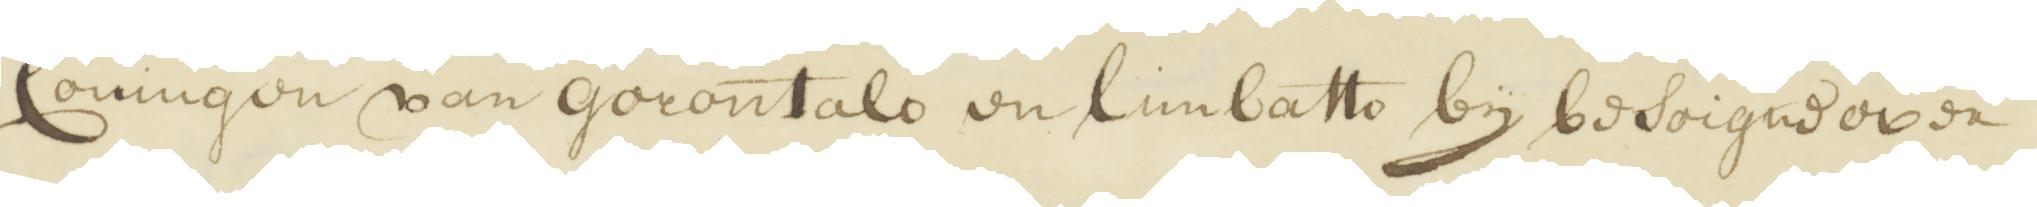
Coningen van gorontalo en limbatto bij besoigne over
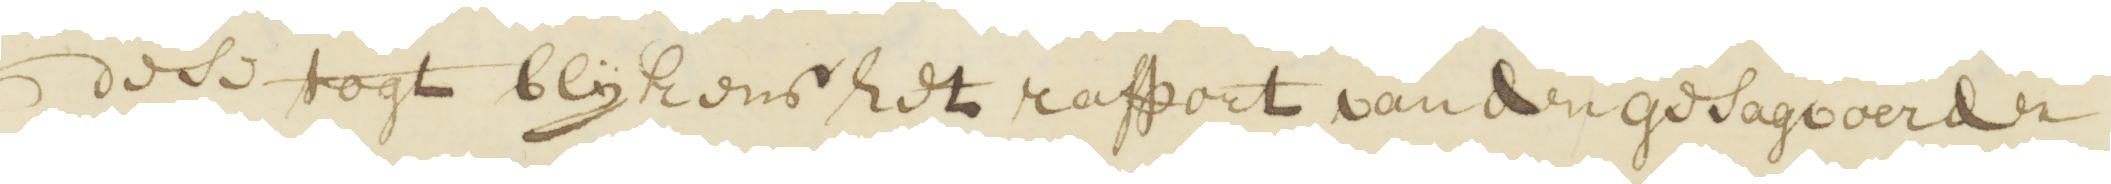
dese togt blijkens het rapport van den gesagvoerder
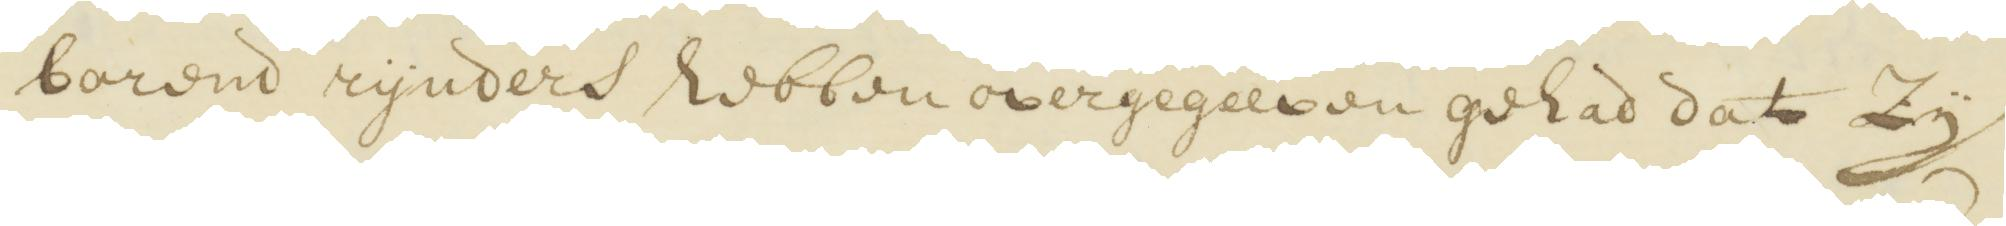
barend rijnders hebben overgegeeven gehad dat zij
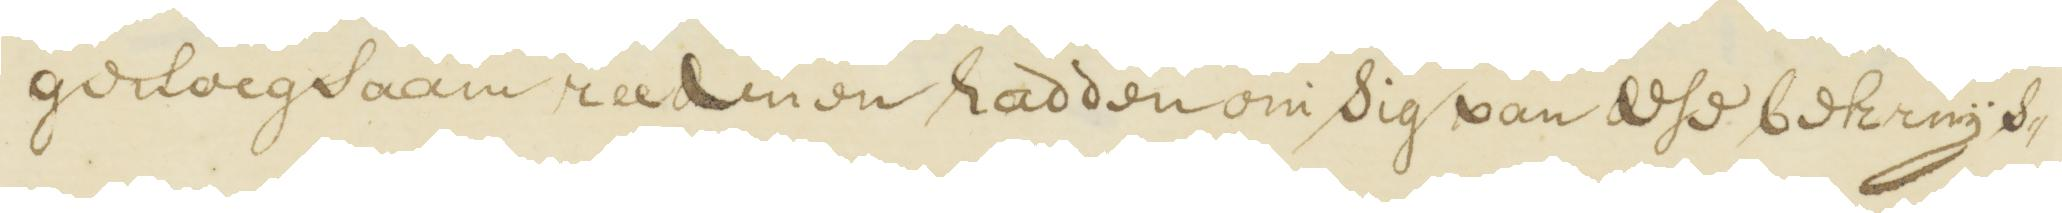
genoegsaam reedenen hadden om sig van dese bekruijs„
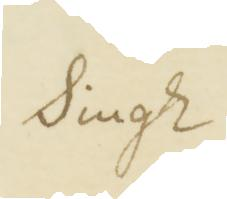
singh
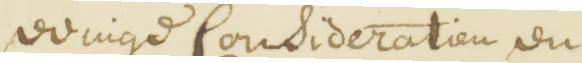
eenige Consideratien en
